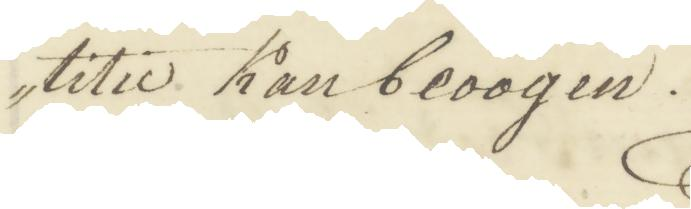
„titie kan beoogen.
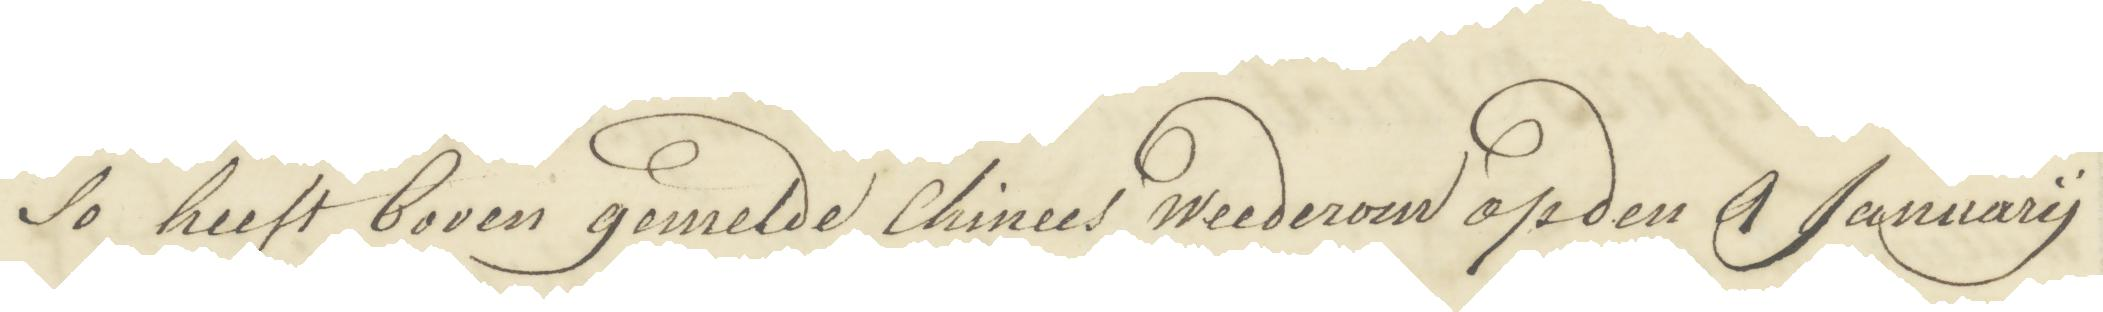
so heeft boven gemelde chinees weederom op den 4 Januarij
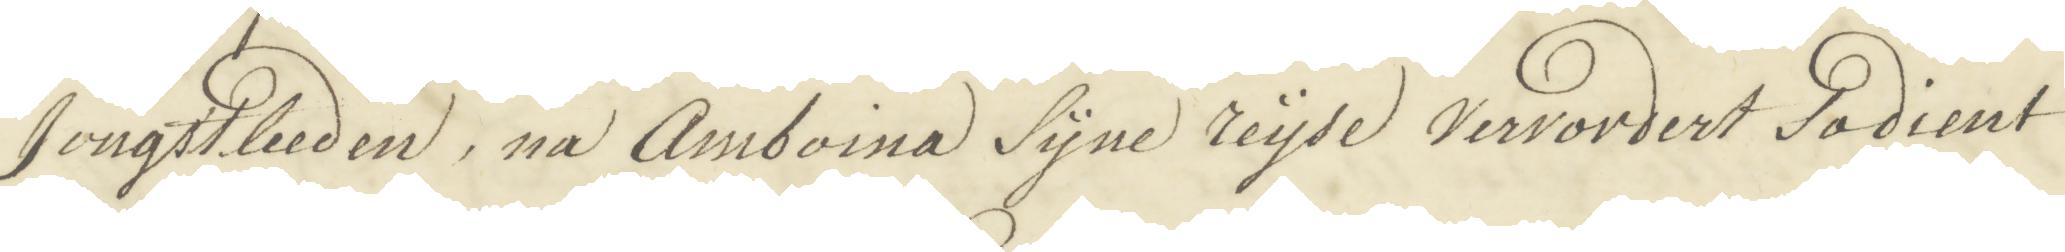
Jongstleeden, na Amboina sijne reijse vervordert so dient
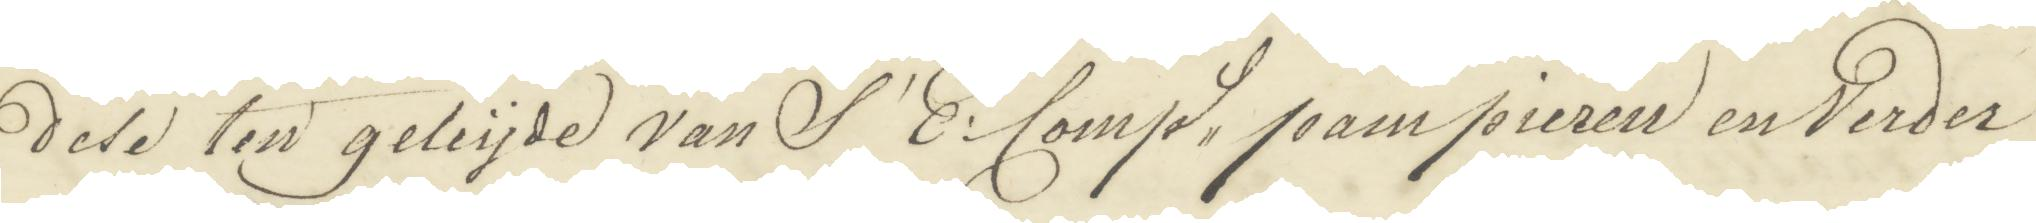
dese ten geleijde van 's E: Comp„s pampieren en verder
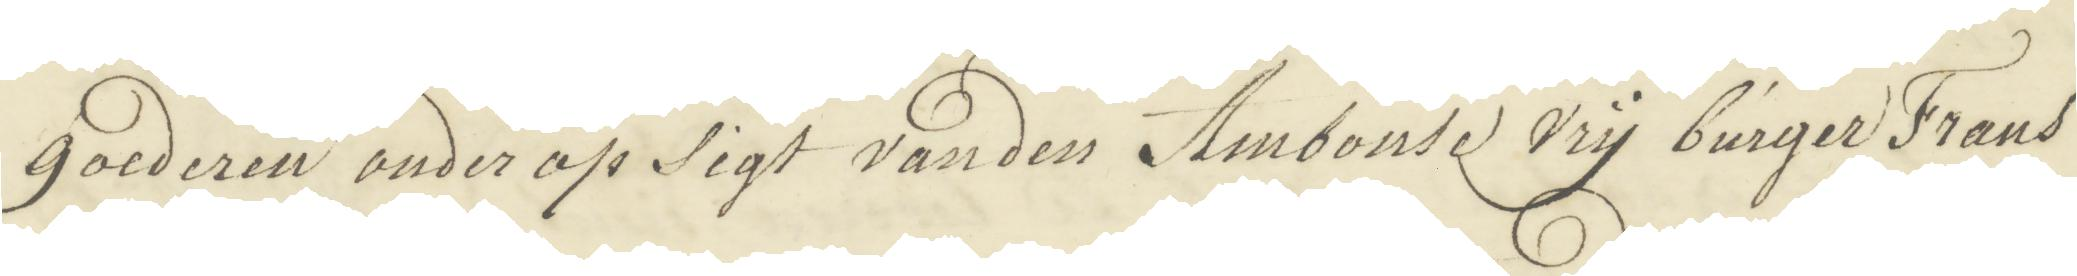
goederen onder op sigt van den Ambonse vrij burger Frans
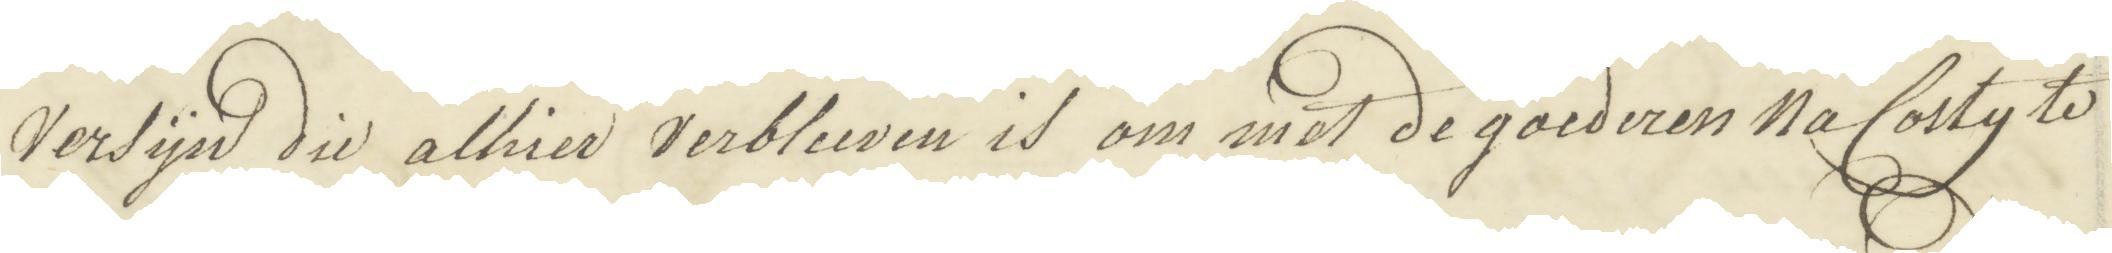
versijn die alhier verbleeven is om met de goederen na Costy te
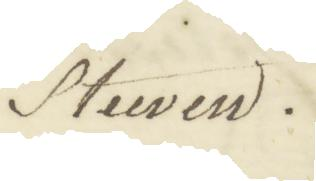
steeven.
